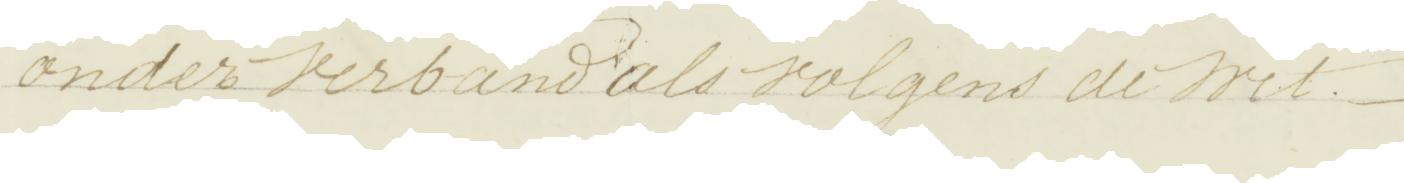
onder verband als volgens de Wet. —
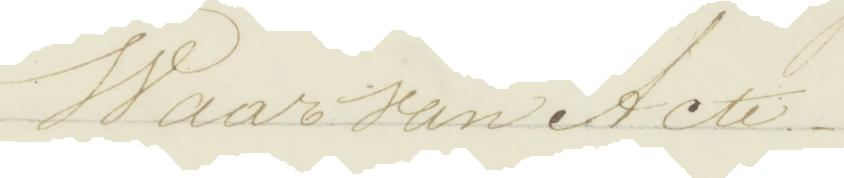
Waar van Acte. —
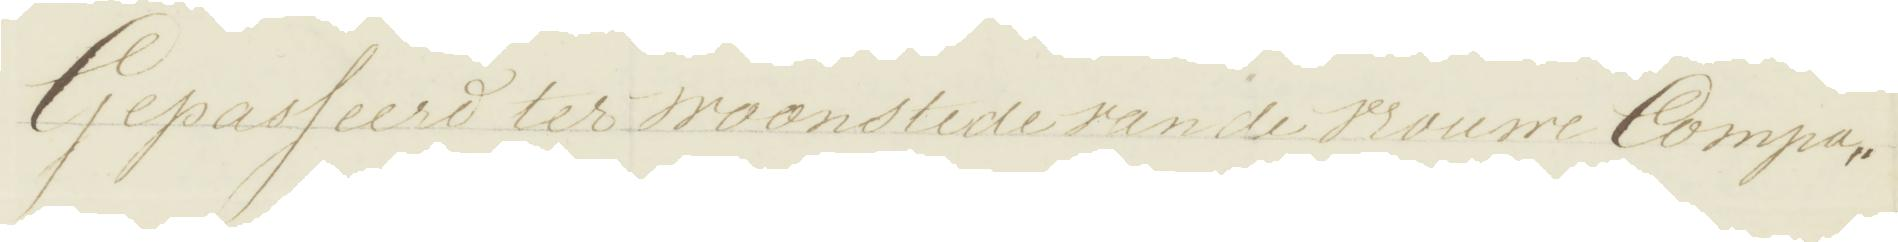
Gepasseerd ter woonstede van de Vrouwe Compa„
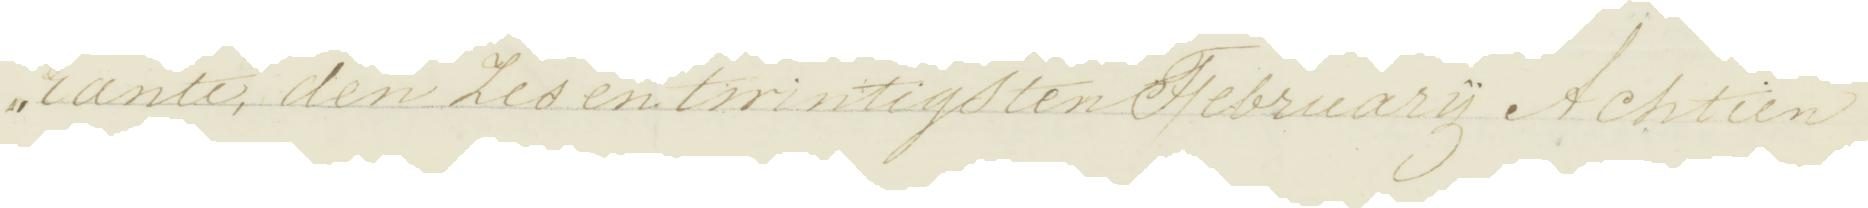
„rante, den zes en twintigsten Februarij Achtien
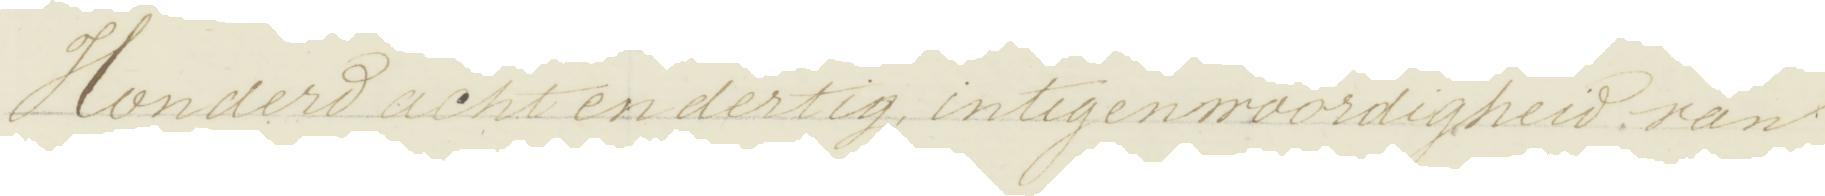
Honderd acht en dertig, in tegenwoordigheid van
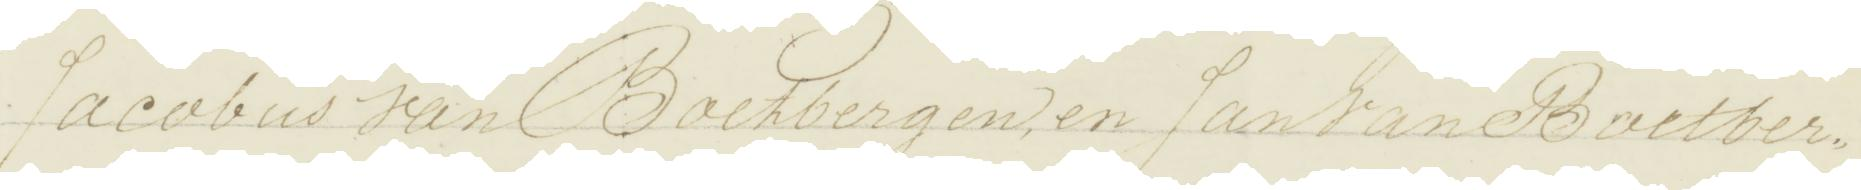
Jacobus van Boetbergen, en Jan van Boetber„
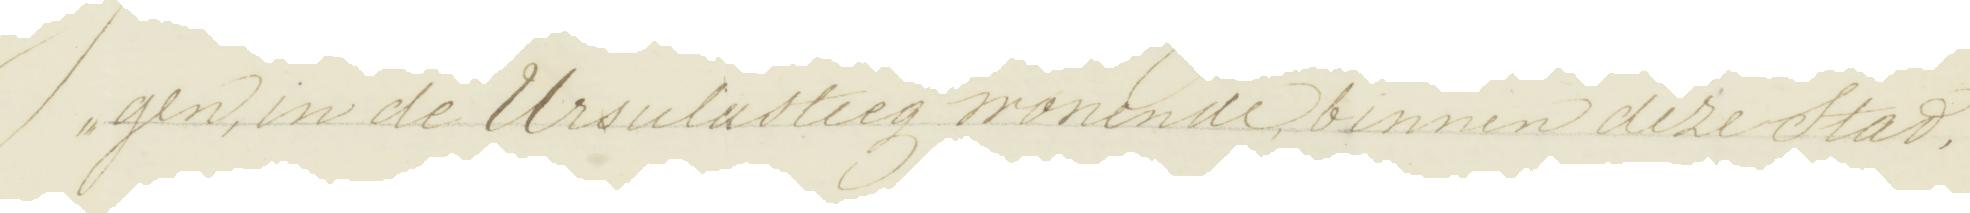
„gen, in de Ursulasteeg wonende, binnen deze Stad,
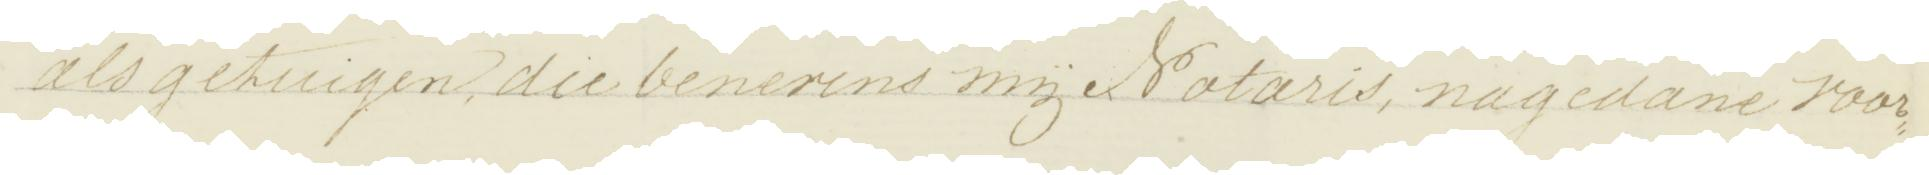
als getuigen, die benevens mij Notaris, na gedane voor„
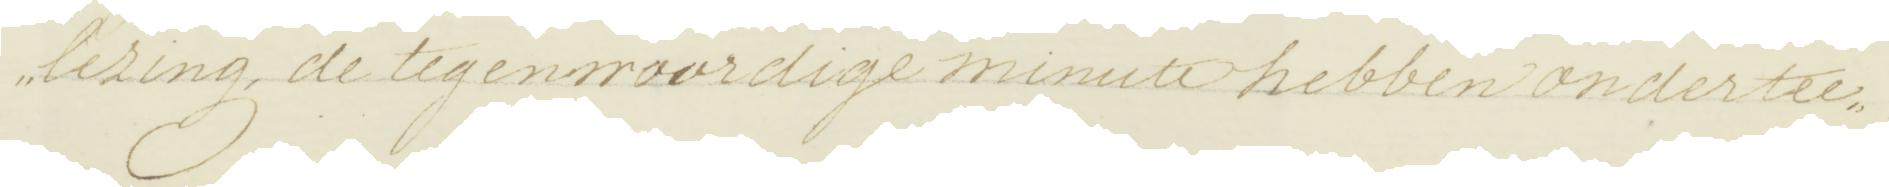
„lezing, de tegenwoordige minute hebben ondertee„
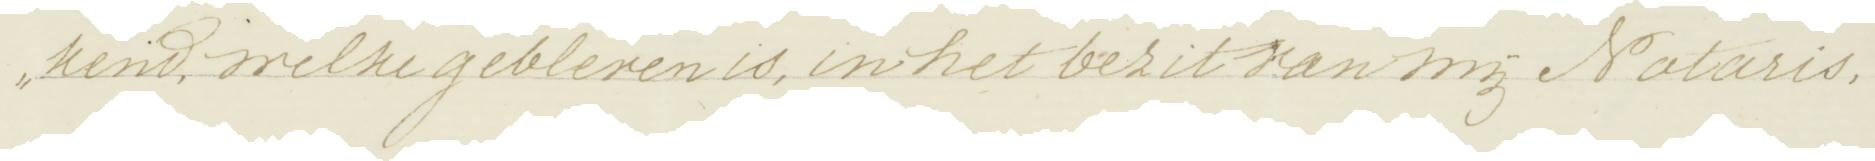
„kend, welke gebleven is, in het bezit van mij Notaris,
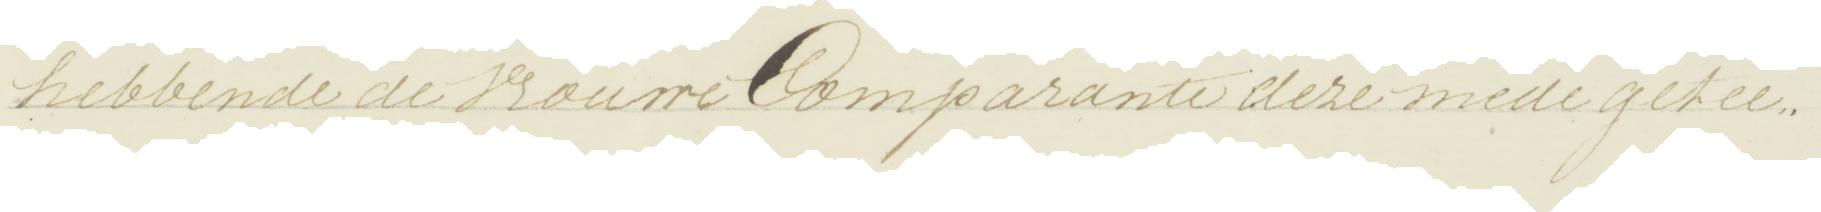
hebbende de Vrouwe Comparantie deze mede getee„
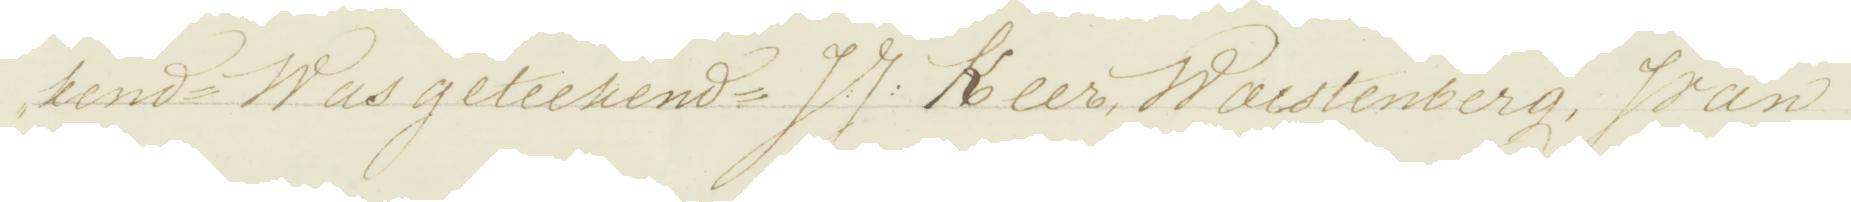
„kend = Was geteekend = J: J: Keer Waistenberg, J van
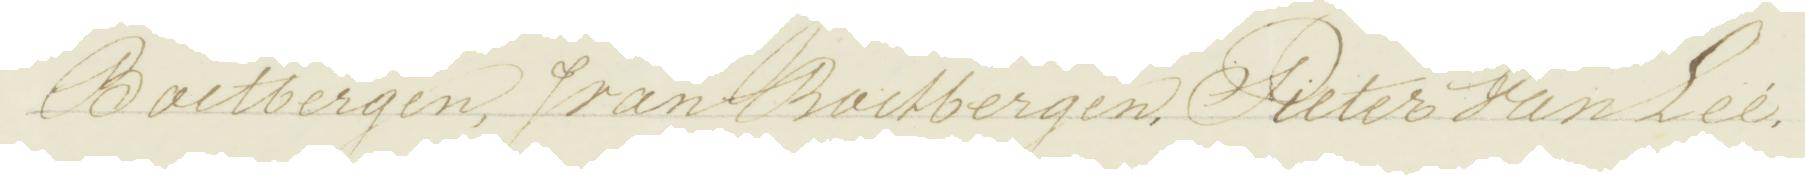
Boetbergen, J van Boetbergen, Pieter van Lee,
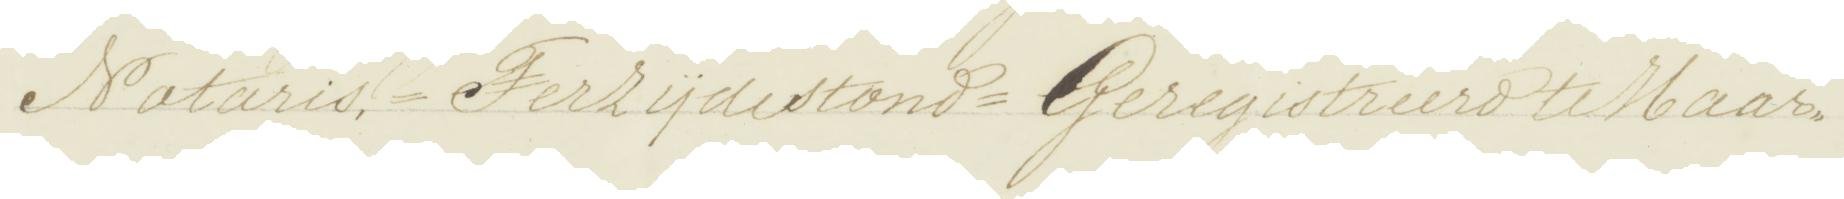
Notaris. = Terzijde stond = Geregistreerd te Haar„
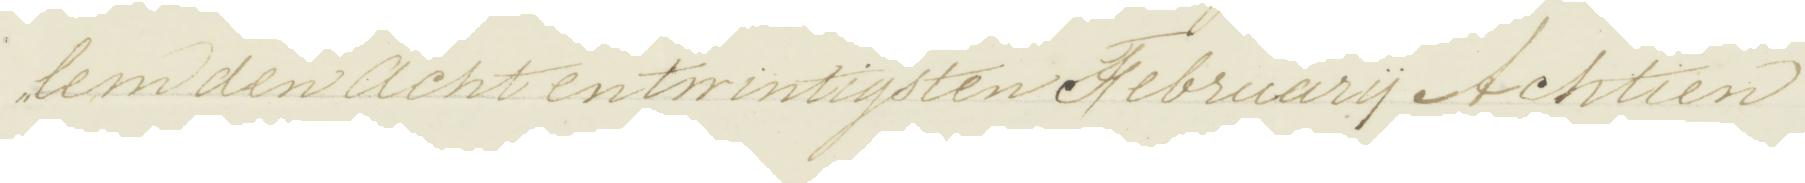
„lem den acht en twintigsten Februarij Achtien
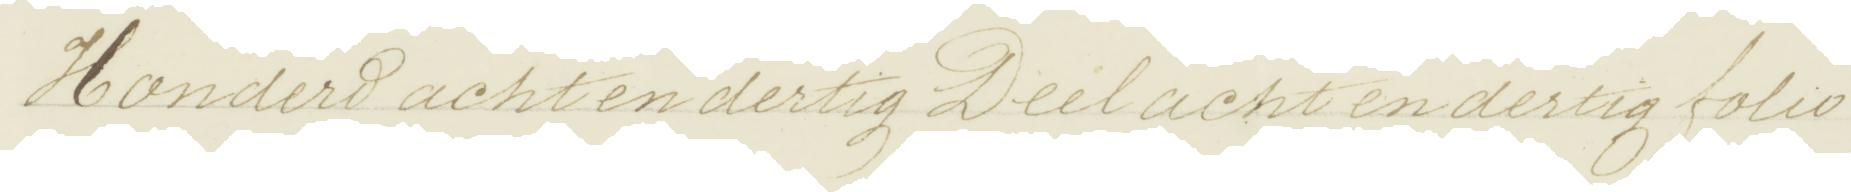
Honderd acht en dertig Deel acht en dertig folio
